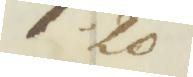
1.20
